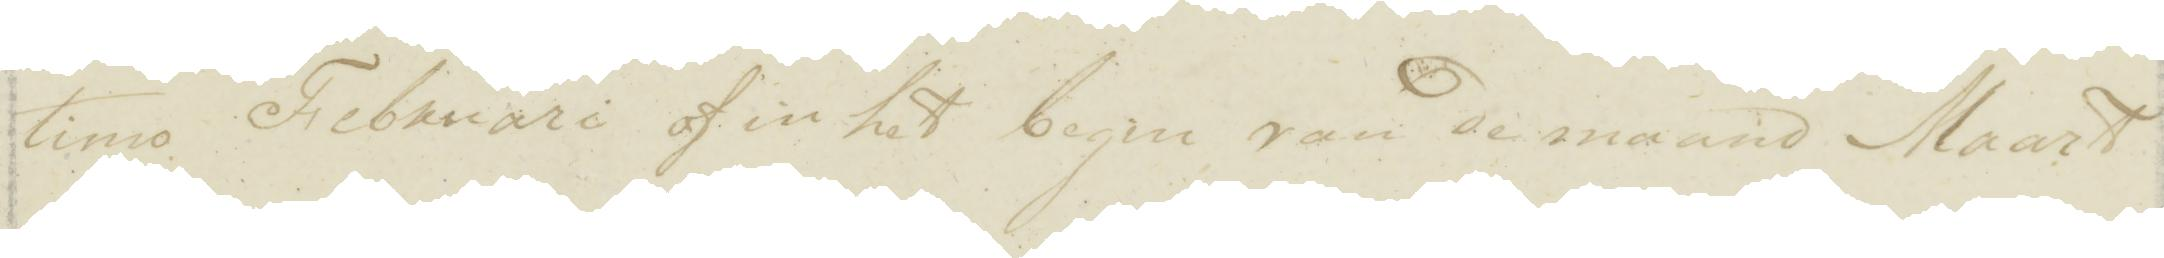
timo Februari of in het begin van de maand Maart
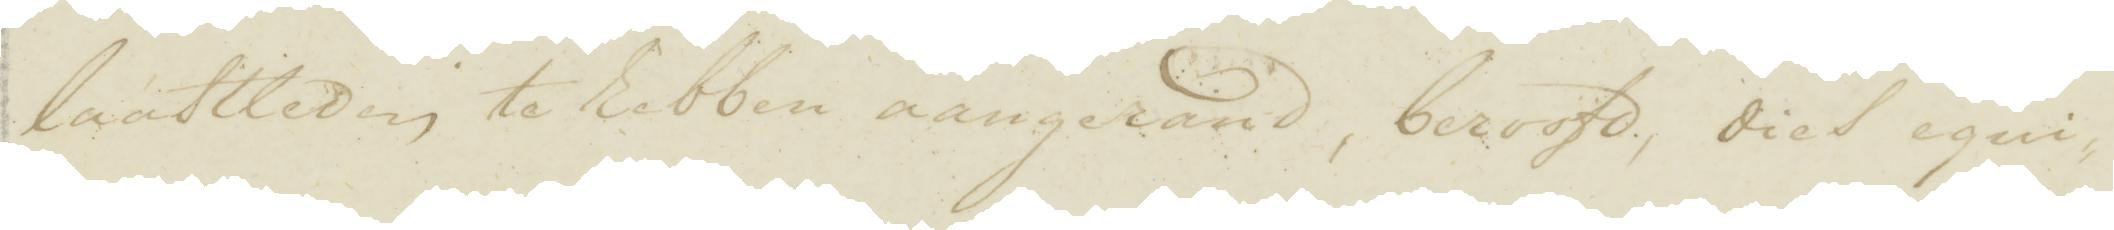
laastleden te hebben aangerand, beroofd, dies equi„
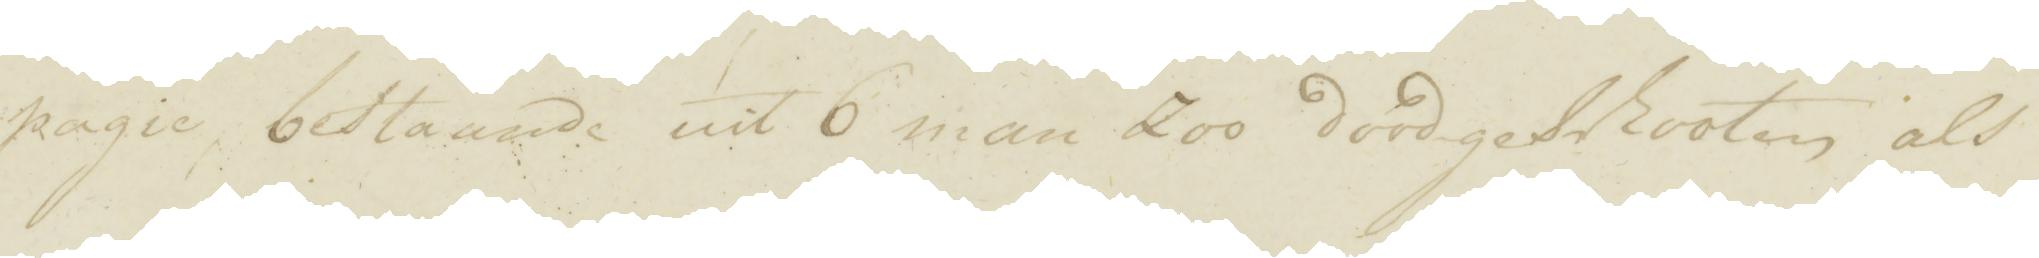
pagie, bestaande uit 6 man zoo dood geschooten als
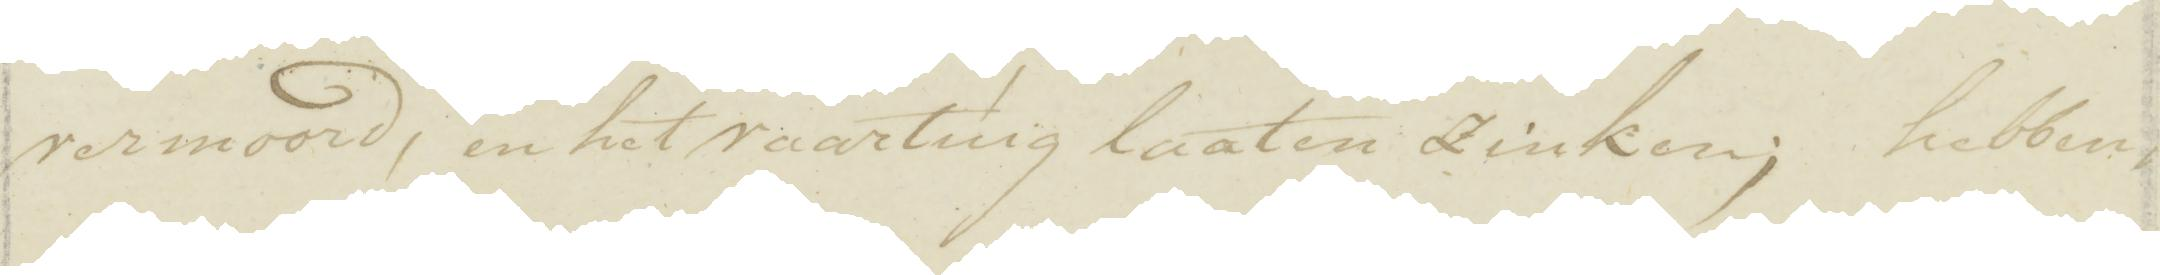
vermoord, en het vaartuig laaten zinken; hebben„
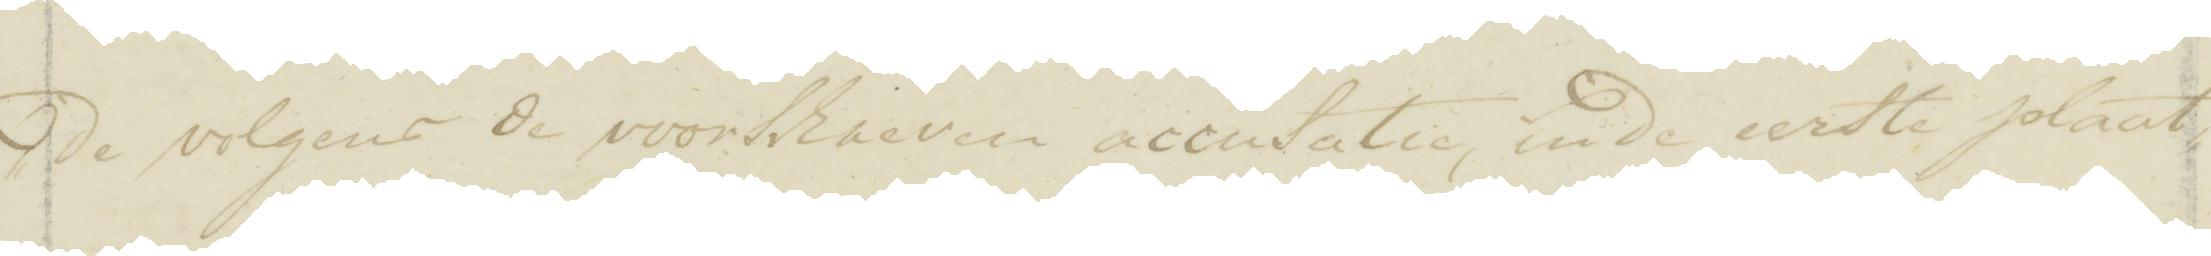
„de volgens de voorschreven accusatie, in de eerste plaat„
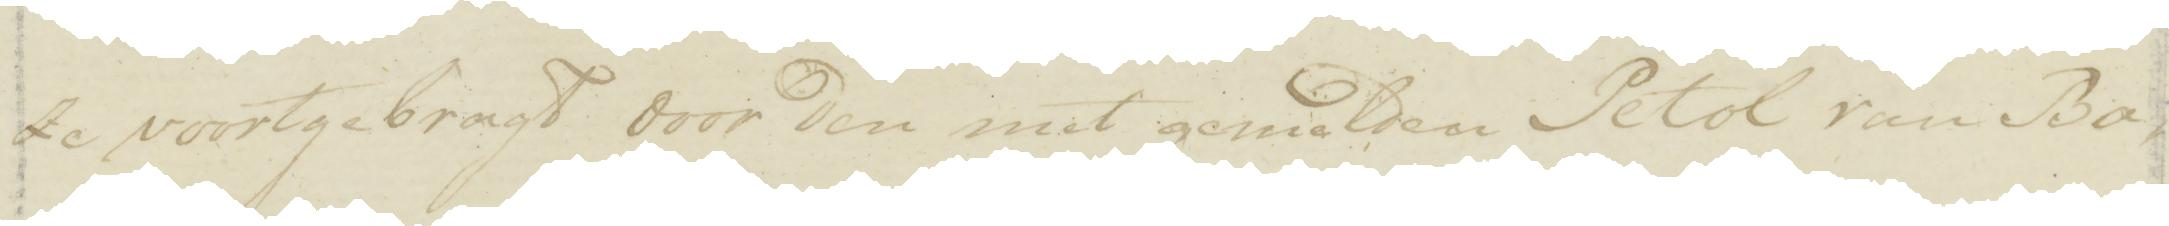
ze voortgebragt door den met gemelden Petol van Ba„
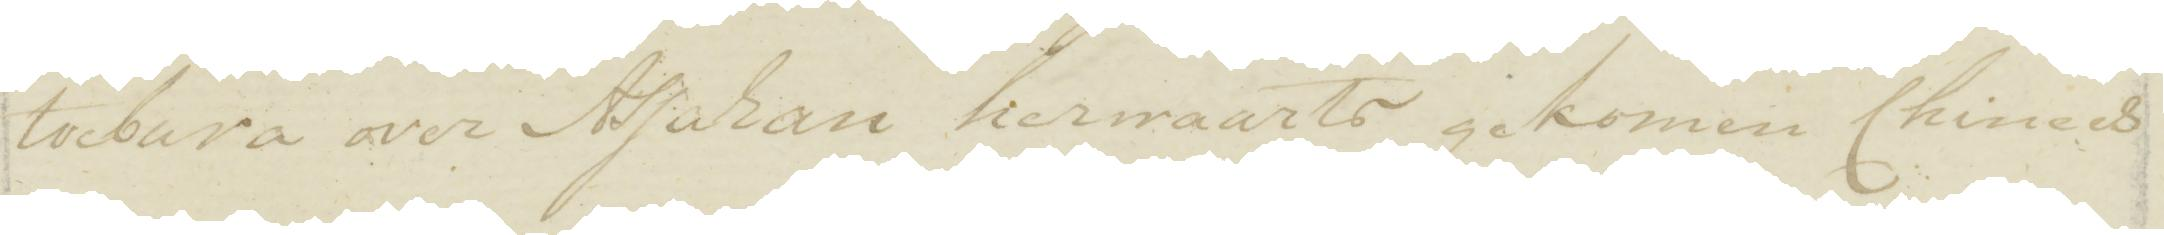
toebara over Assahan herwaarts gekomen Chinees
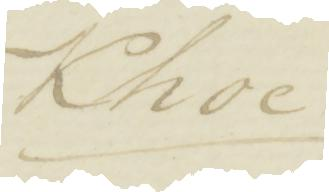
Khoe
